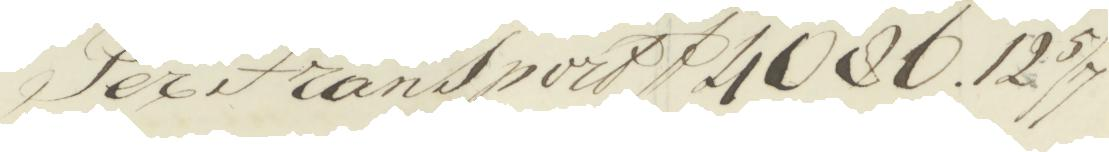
Per Transport ƒ 4086.12 5/7
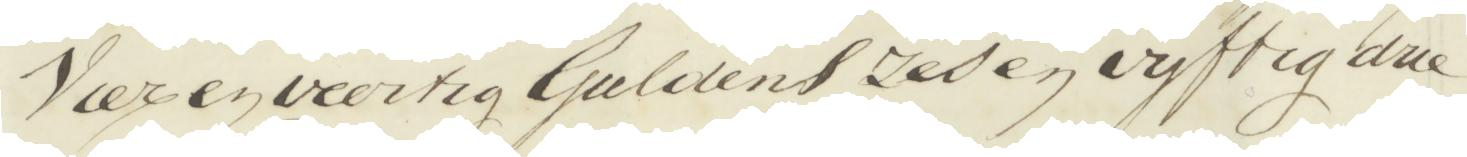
Vier en veertig Guldens zes en vyftig drie
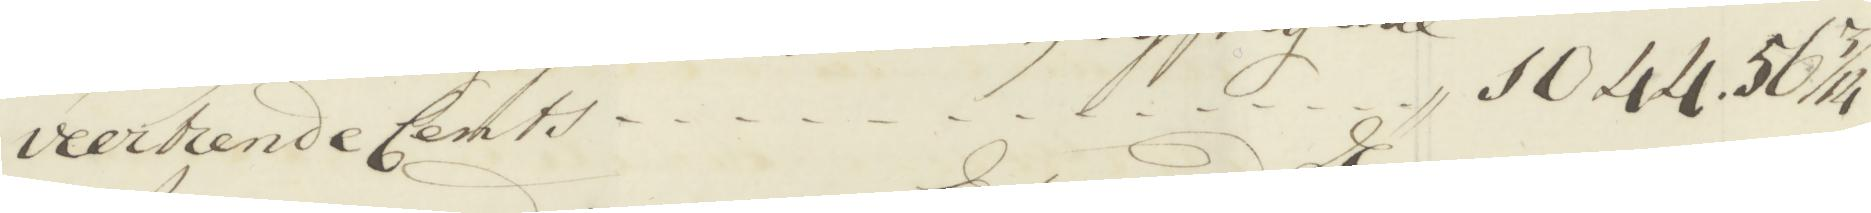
veertiende Cents . . . . . . . . . . . . . . „10 44.56 3/14
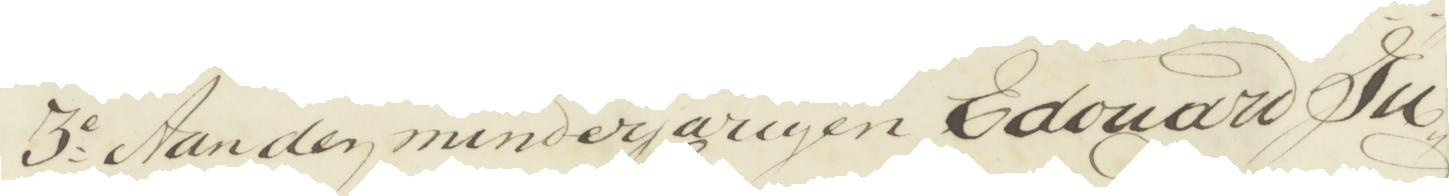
3=e Aan den minderjarigen Edouard Iu„
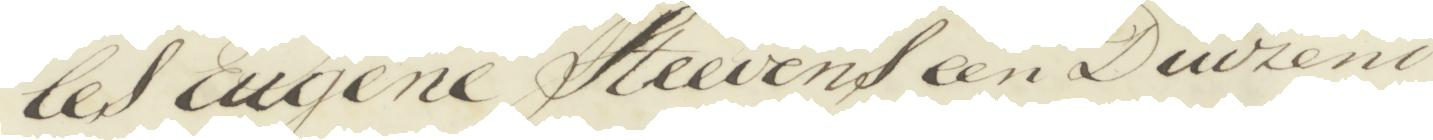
les Eugène Steevens een Duizend
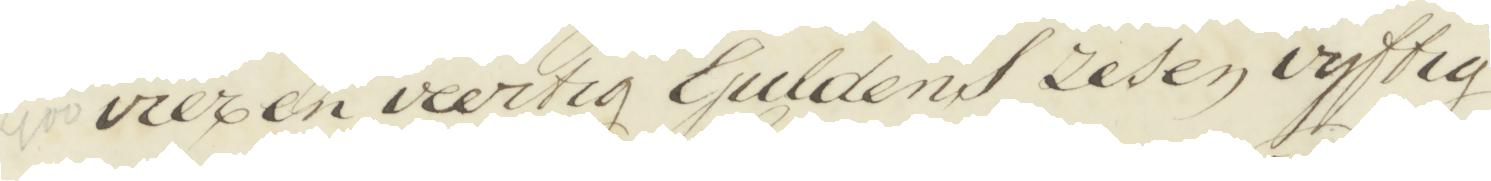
vier en veertig Guldens zesen vyftig
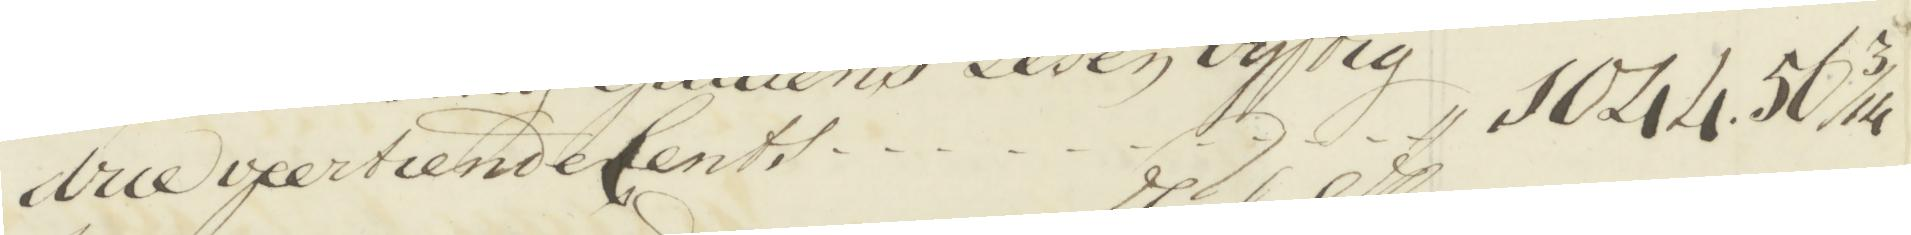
drie veertiende Cents . . . . . . . . . . . „1044.56 3/14
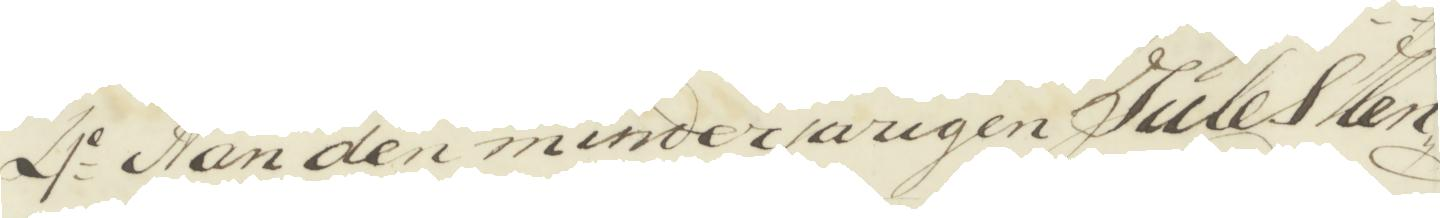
4=e Aan den minderjarigen Iules Hen
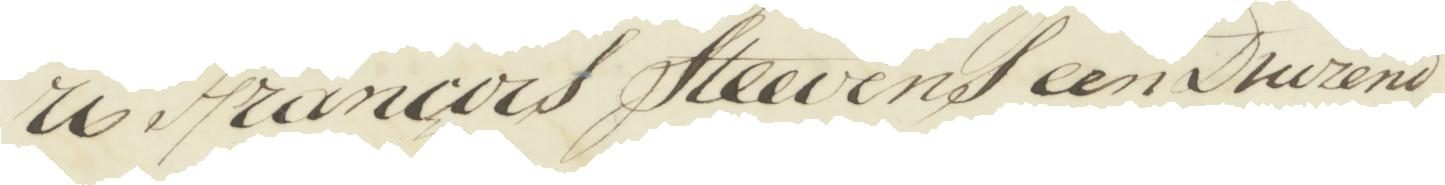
ri François Steevens een Duizend
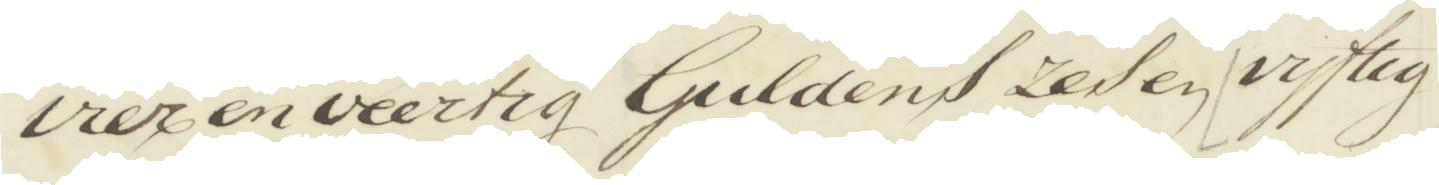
vier en veertig Guldens zes en vyftig
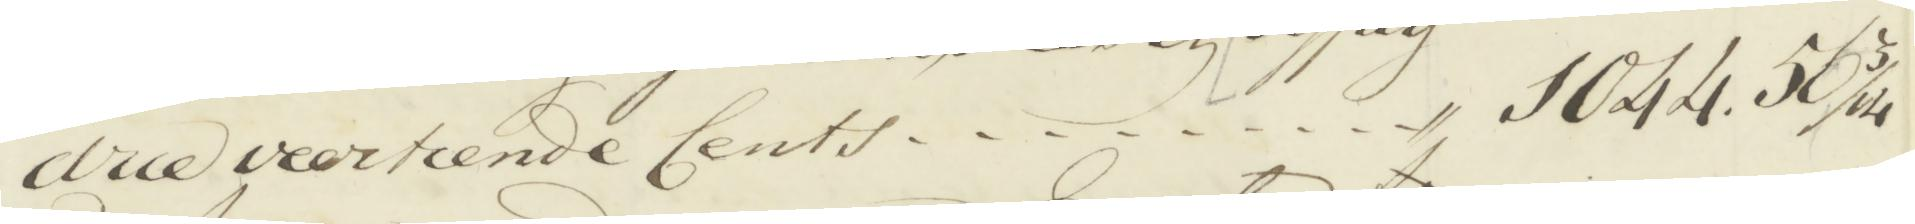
drie veertiende Cents . . . . . . . . . „1044.56 3/14.
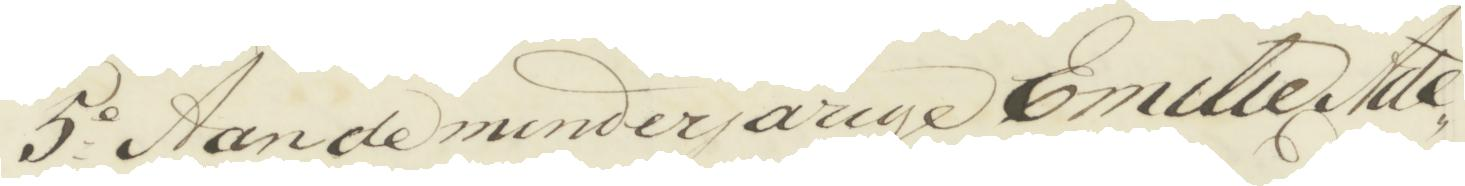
5=e Aan de minderjarige Emilie Ade„
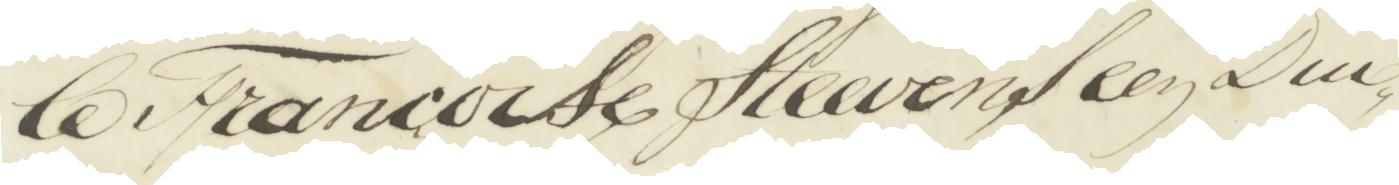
le Françoise Steevens een Dui„
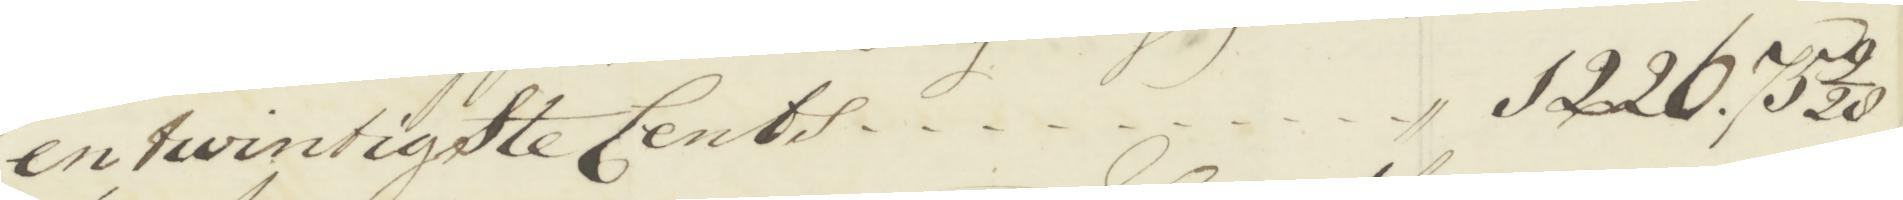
en twintigste Cents. . . . . . . . . .„ 1226.75 9/28
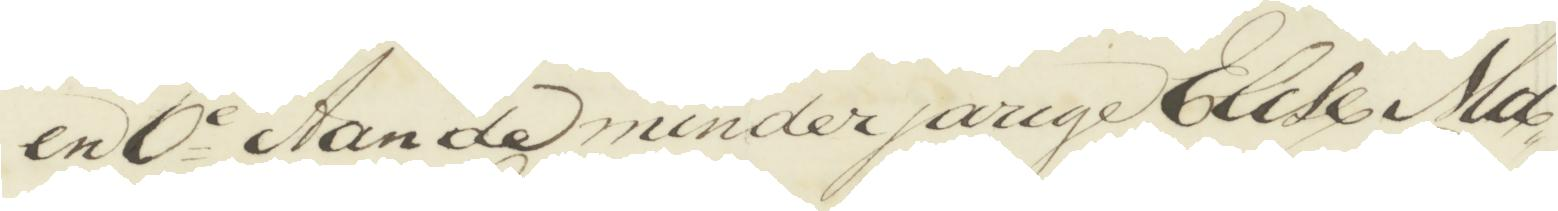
en 6=e Aan de minderjarige Elise Ma„
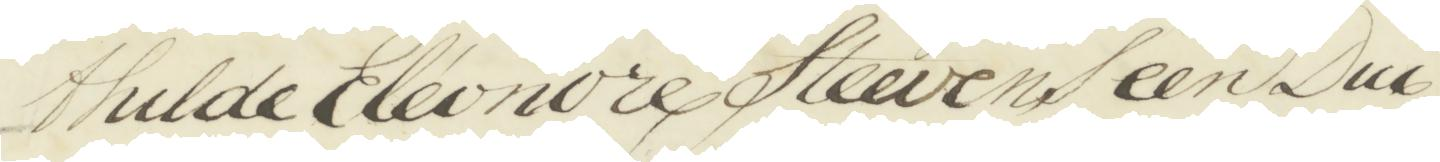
„thilde Eleonore Steevens een Dui
